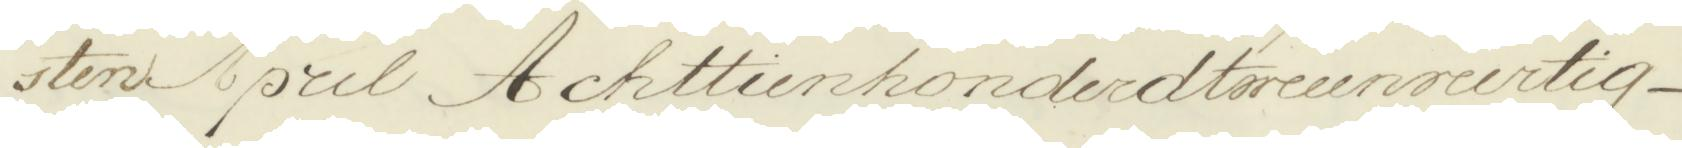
sten April Achttienhonderd twee en veertig -
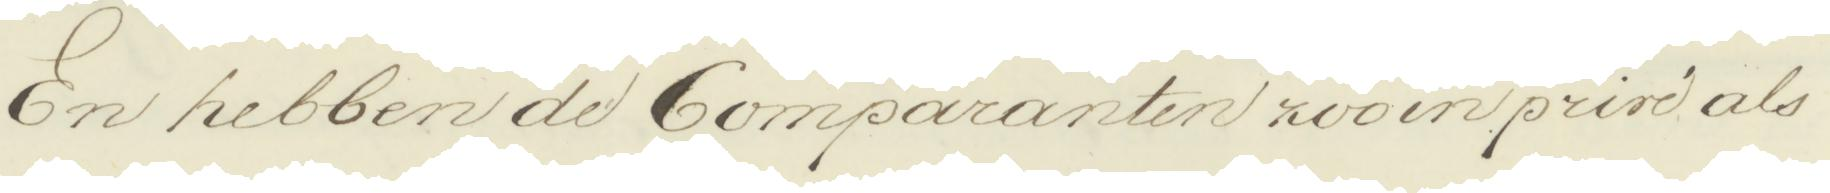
En hebben de Comparanten zoo in privé als
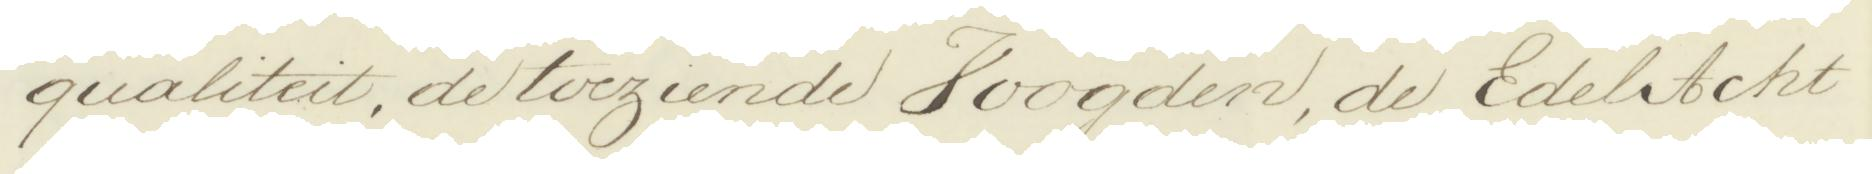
qualiteit, de toeziende Voogden, de Edel Acht
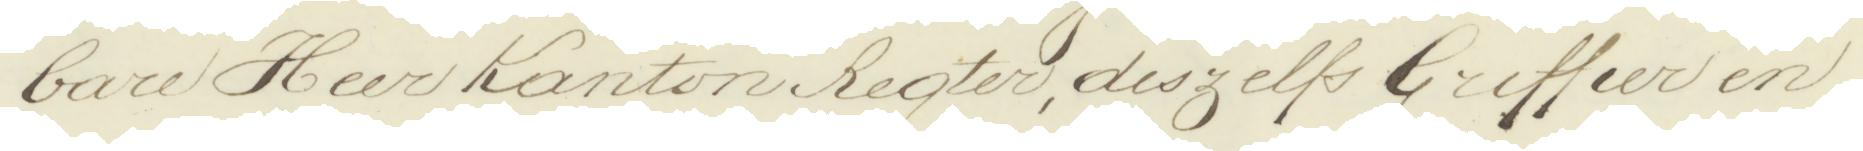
bare Heer Kanton Regter, deszelfs Griffier en
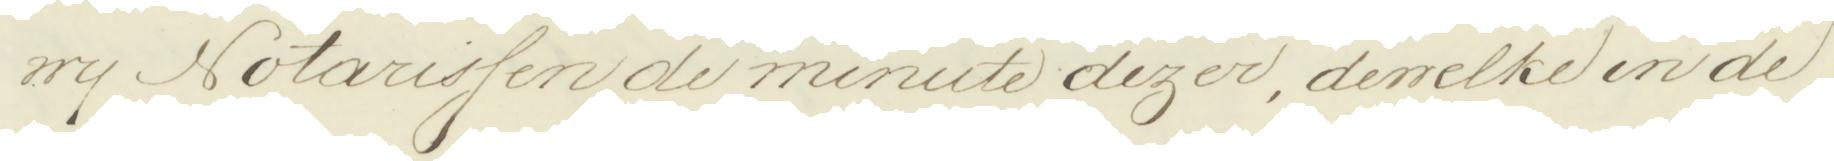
wy Notarissen de minute dezer, dewelke in de
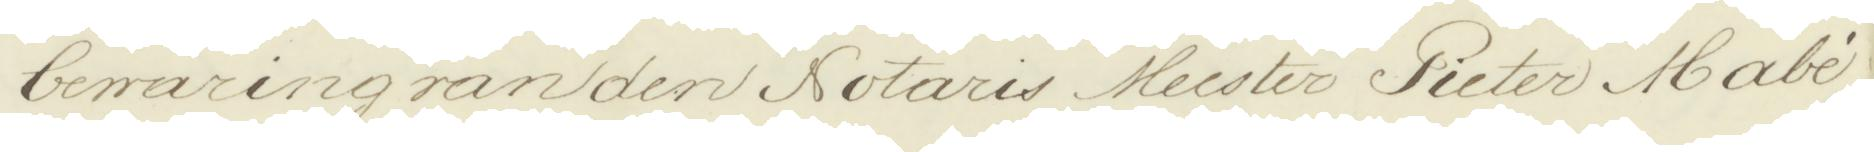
bewaring van den Notaris Meester Pieter Mabé
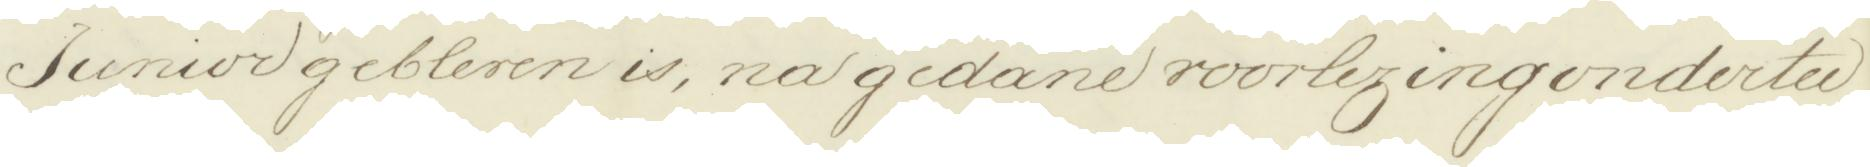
Junior gebleven is, na gedane voorlezing ondertee
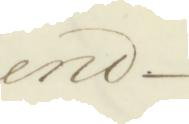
end.-
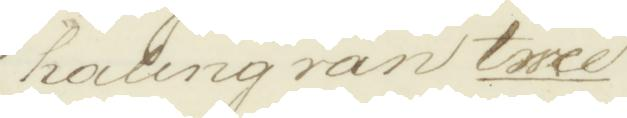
haling van twee
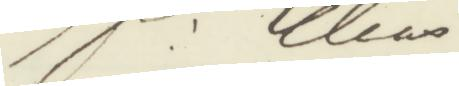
P: Elias
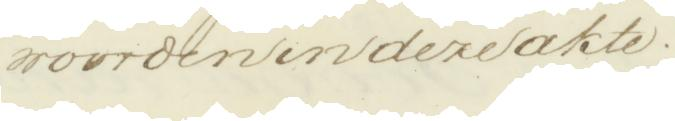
woorden in deze akte
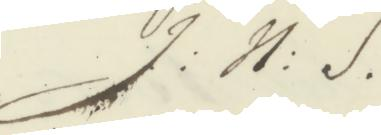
J: H: S.
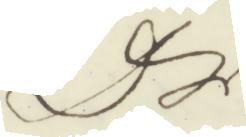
DW
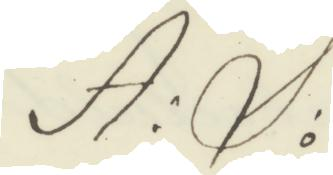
A: S:
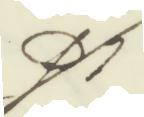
PE
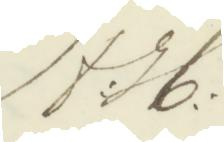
t: H.
